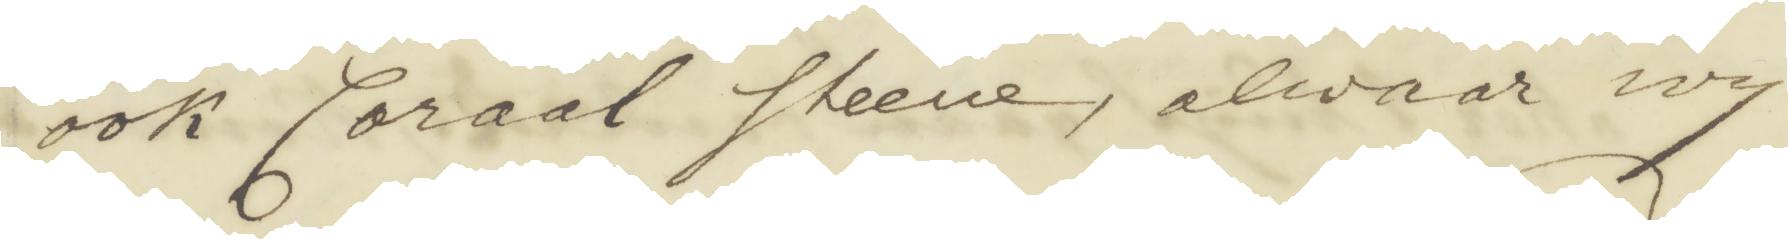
ook Coraal steene, alwaar wij
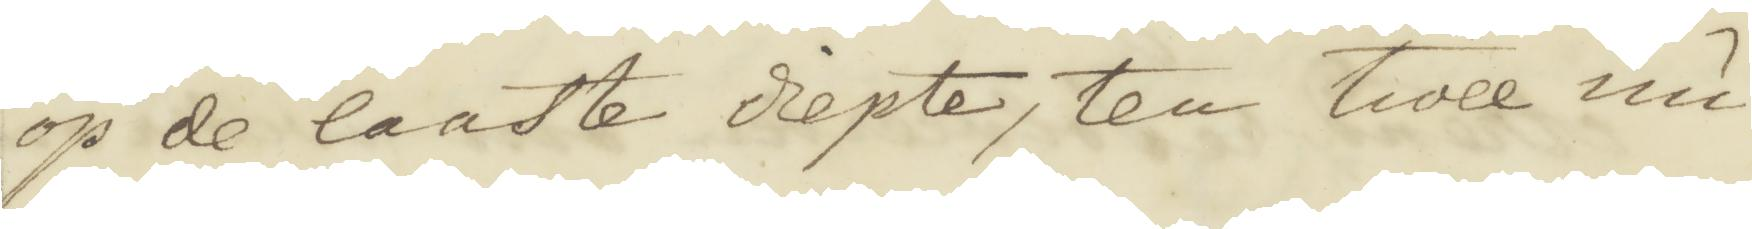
op de laaste diepte, ten twee uu:
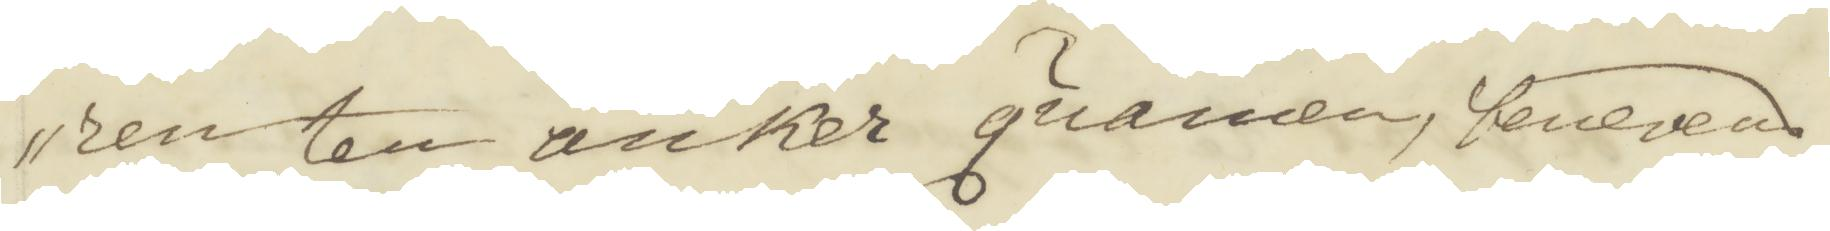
„ren ten anker quamen, benevens
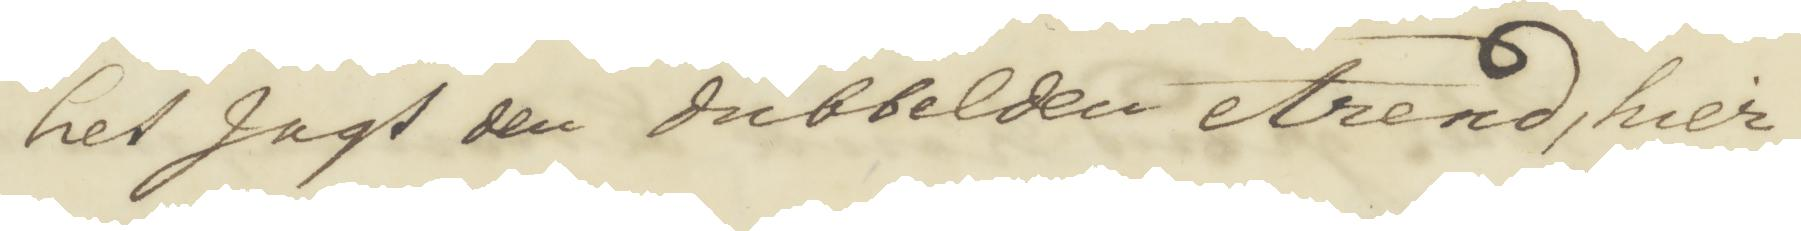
het jagt den dubbelden Arend, hier
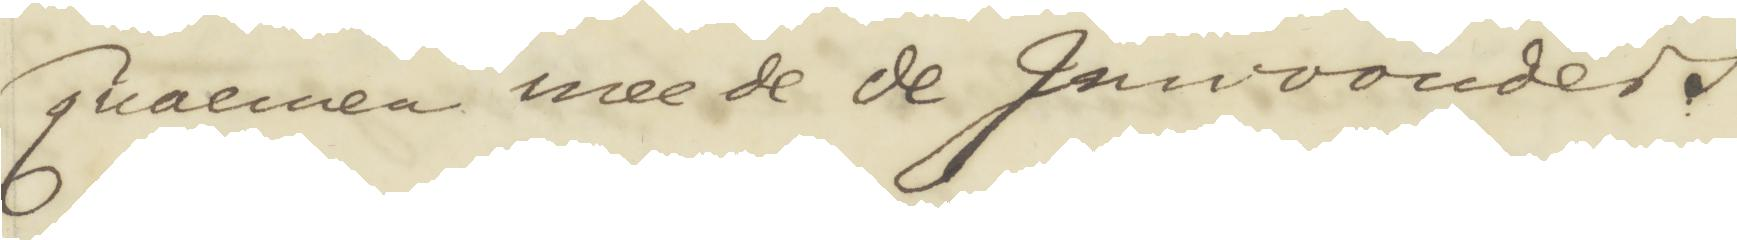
quaemen meede de Jnwoonders
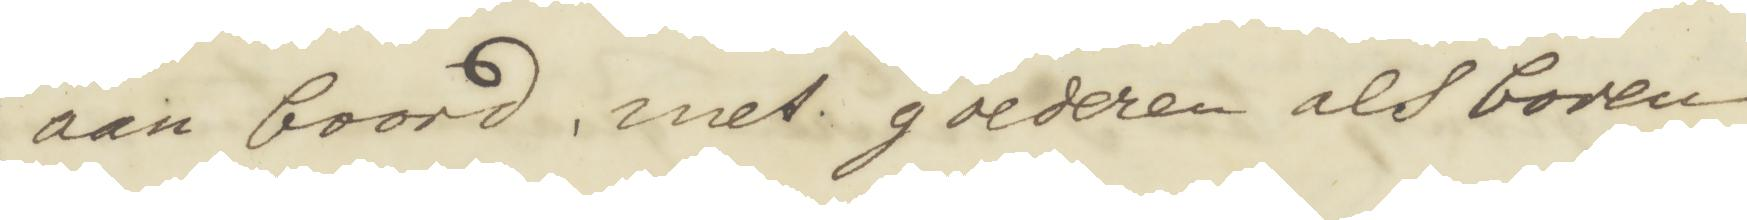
aan boord, met goederen als boven,
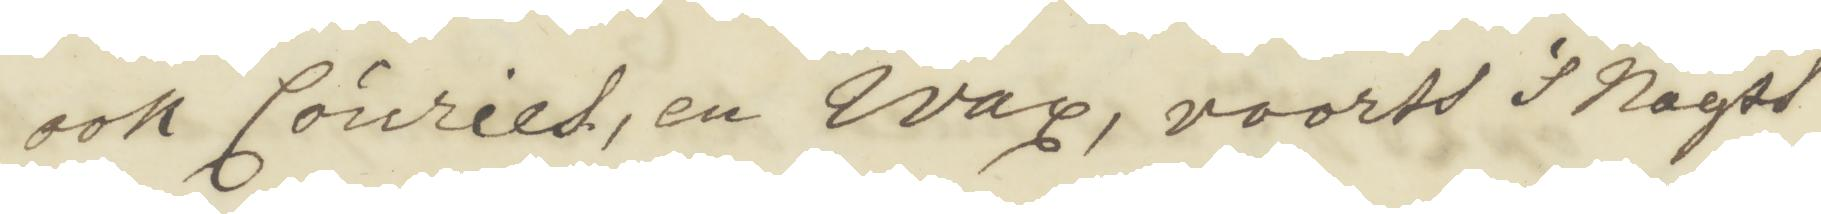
ook Couries, en wax, voorts 's nagts
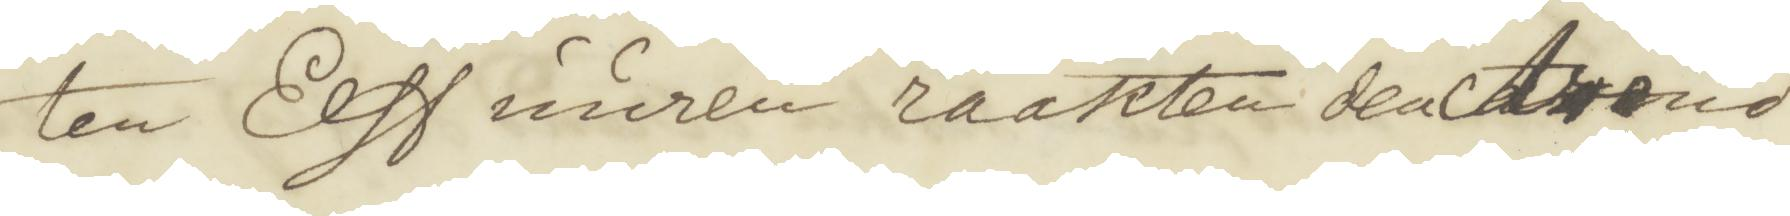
ten Elff uuren raakten der Arend
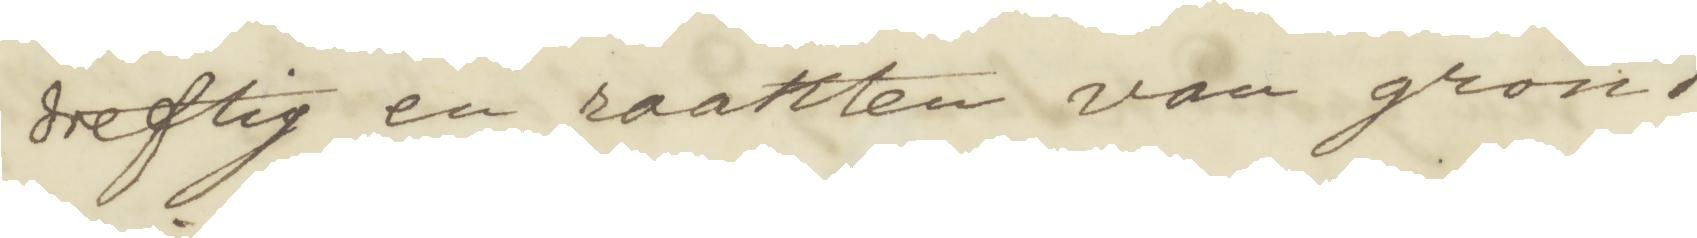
dreftig en raakten van grond
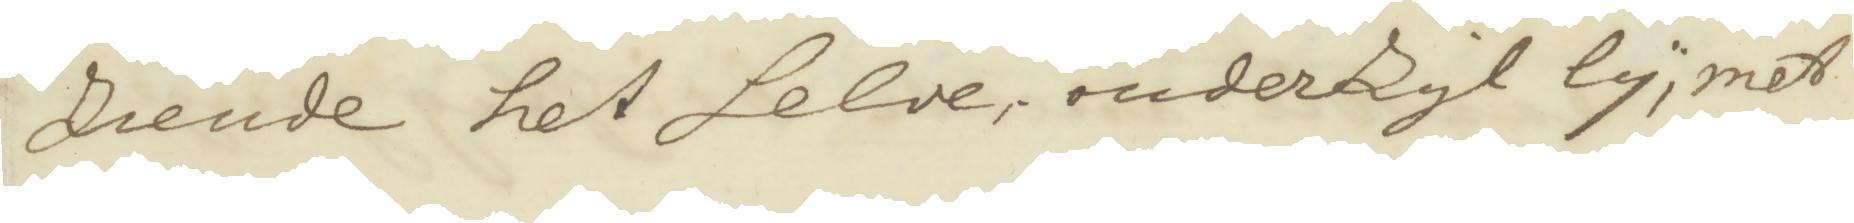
ziende het selve, onderzijl lij; met
